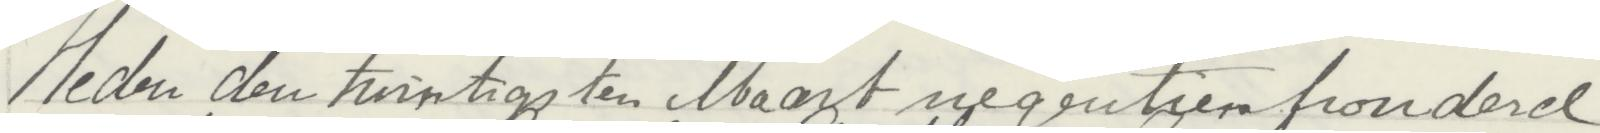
Heden den twintigsten Maart negentien honderd
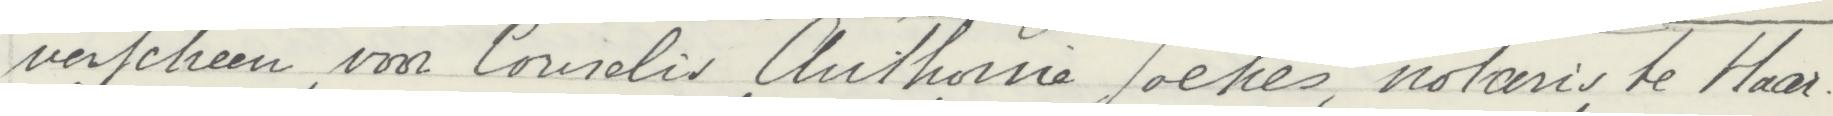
verscheen voor Cornelis Authonie Joekes, notaris te Haar
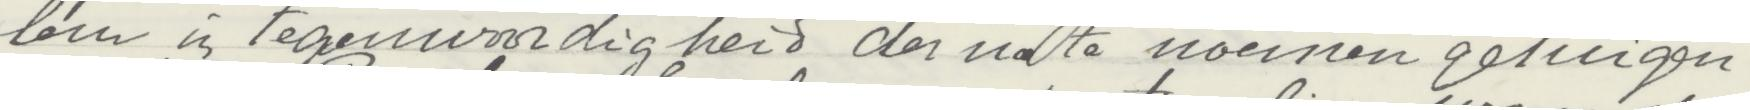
lem in tegenwoordigheid der na te noemen getuigen
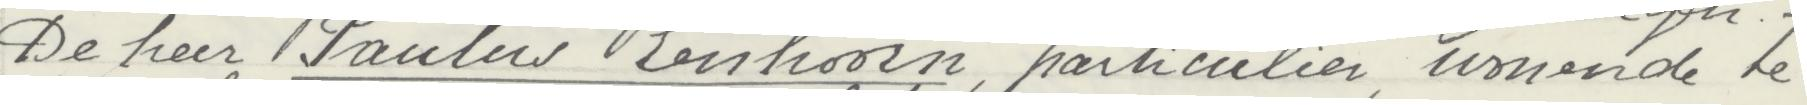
De heer Paulus Eenhoorn, particulier, wonende te
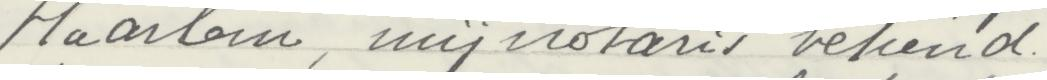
Haarlem, mij notaris bekend
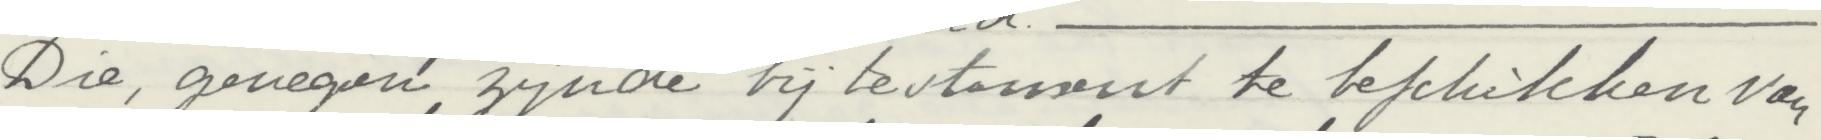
Die, genegen zijnde bij testament te beschikken van
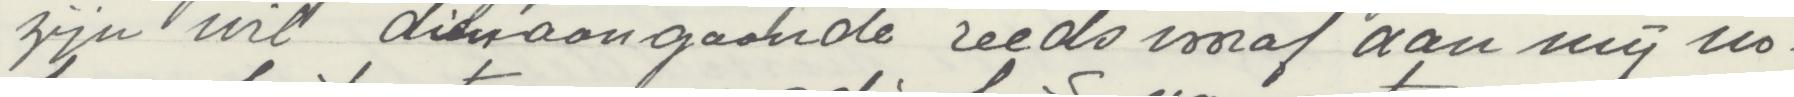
zijn uit dien aangaande reeds vooraf aan mij no
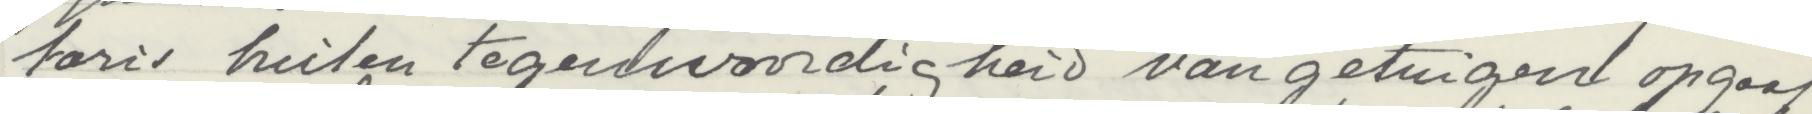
taris buiten tegenwoordigheid van getuigen opgaaf
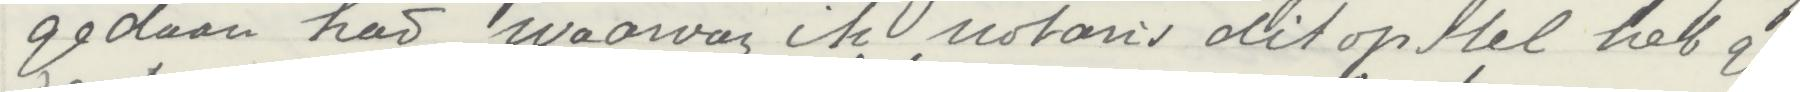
gedaan had waarvan ik notaris dit op stel heb ge
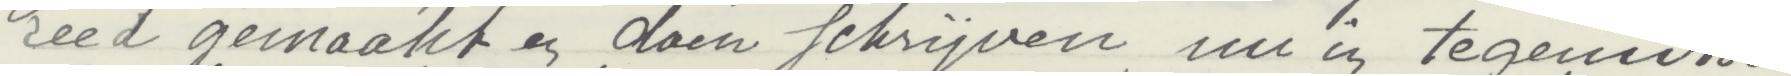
reed gemaakt en doen schrijven nu in tegenwoor-
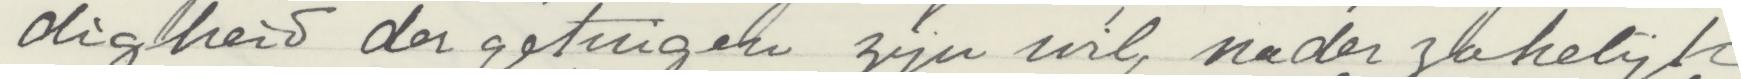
digheid der getuigen zijn wil, nader zakelijk
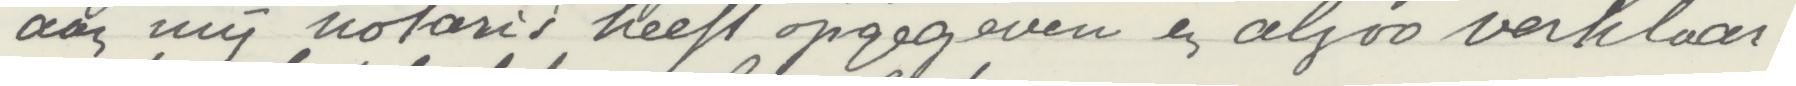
aan mij notaris heeft opgegeven en alzoo verklaar.
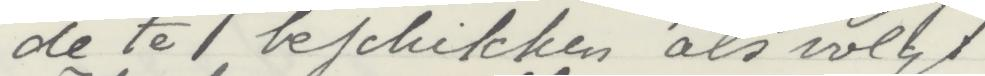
de te beschikken als volgt
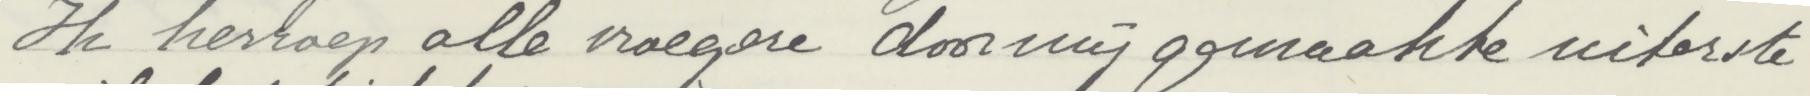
Ik herroep alle vroegere door mij gemaakte uiterste
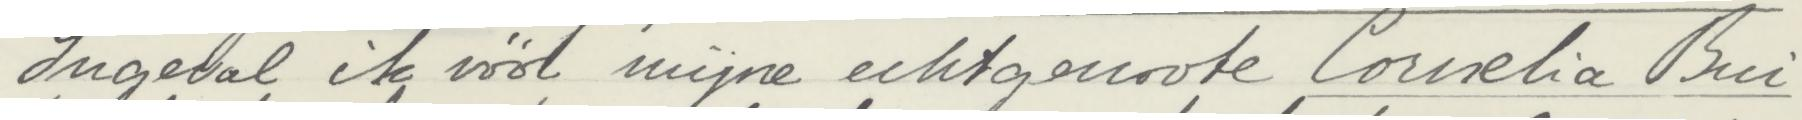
Ingeval ik vóór mijne echtgenoote Cornelia Bui
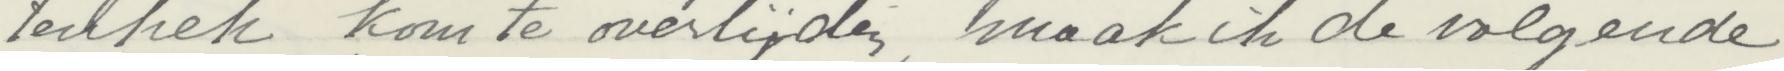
tenhek kom te overlijden, maak ik de volgende
